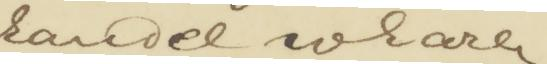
handel wharen
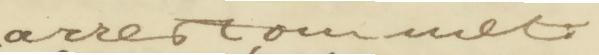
arrest om niet
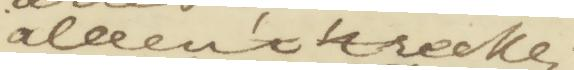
alleen te reeken
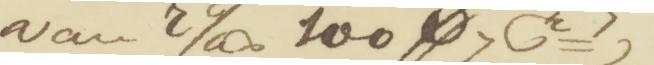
van R o/a 100 O pC=t
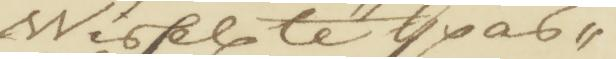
wissel te pas„
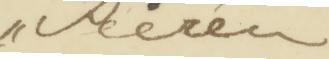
„seeren
